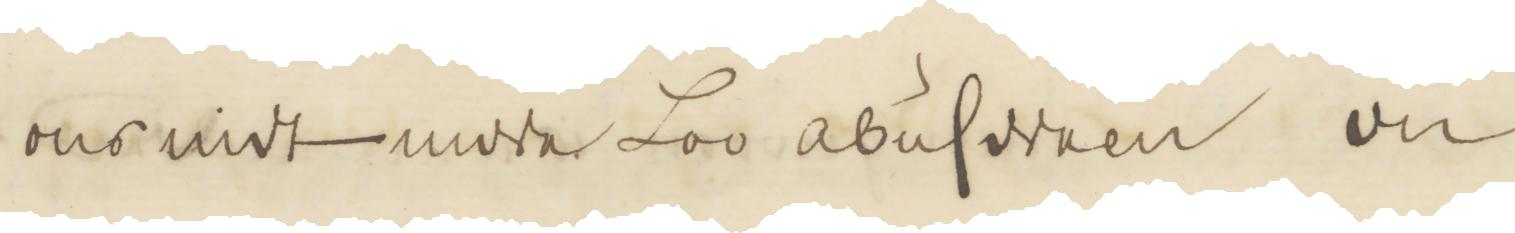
ons niet meer soo abuseeren en
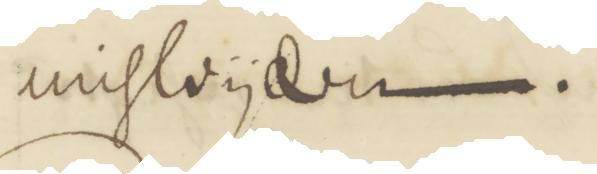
misleijden.
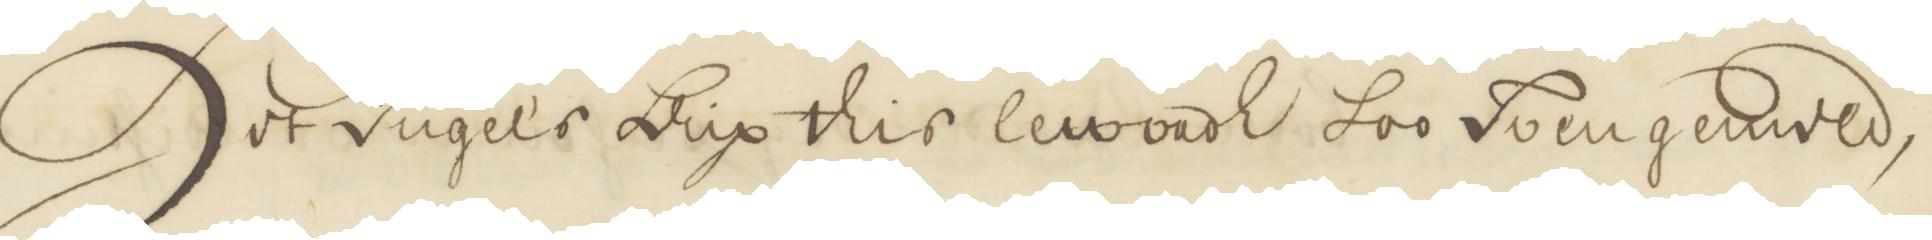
Het Engels schip this lewordh soo Even gemeld,
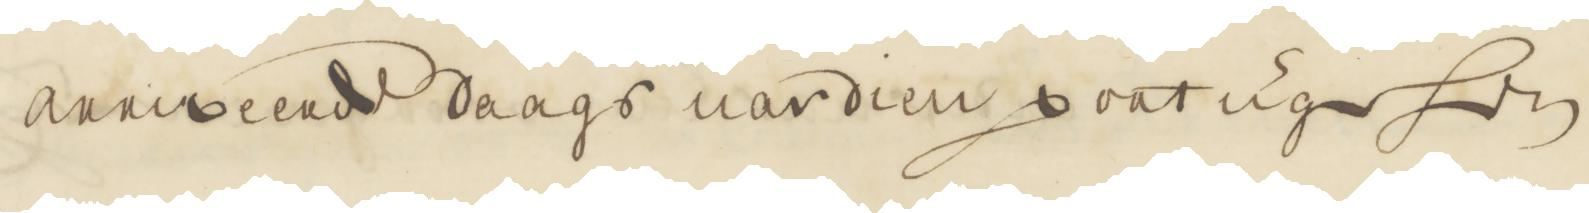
arriveerde daags nae dien portugesen
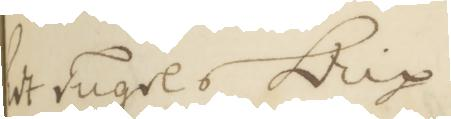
et Engels schip
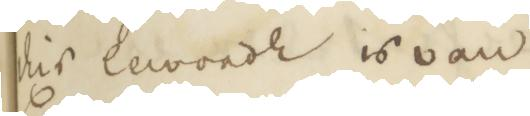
his lewordh is van
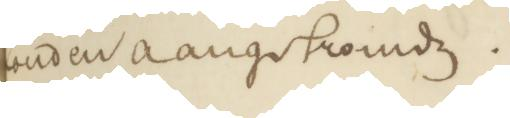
onden aangekomen.
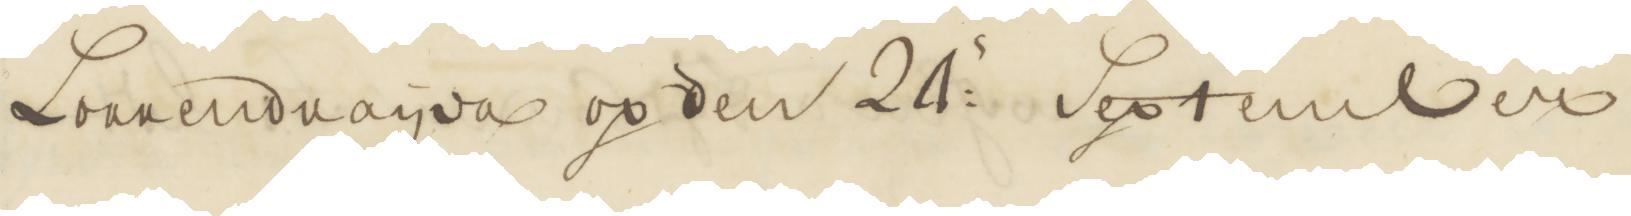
Lorrendraijver op den 24:en september
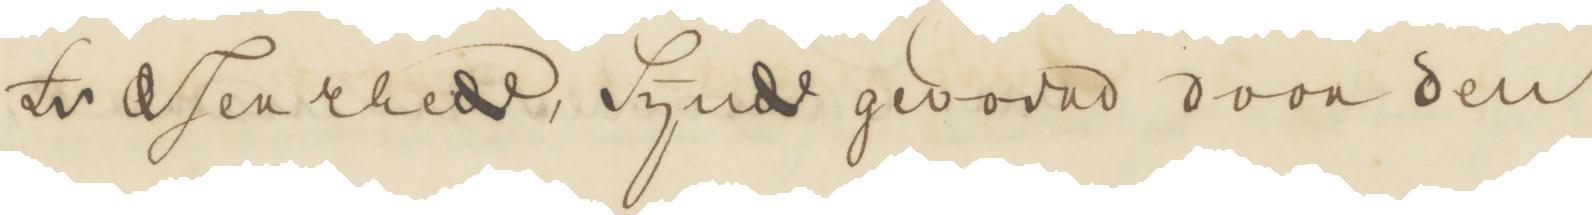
te deser rhede, sijnde gevoerd door den
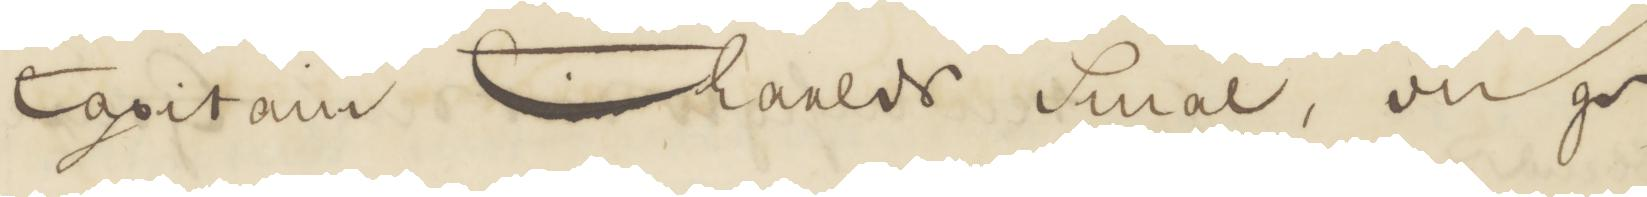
capitain Charles Smal, en ge
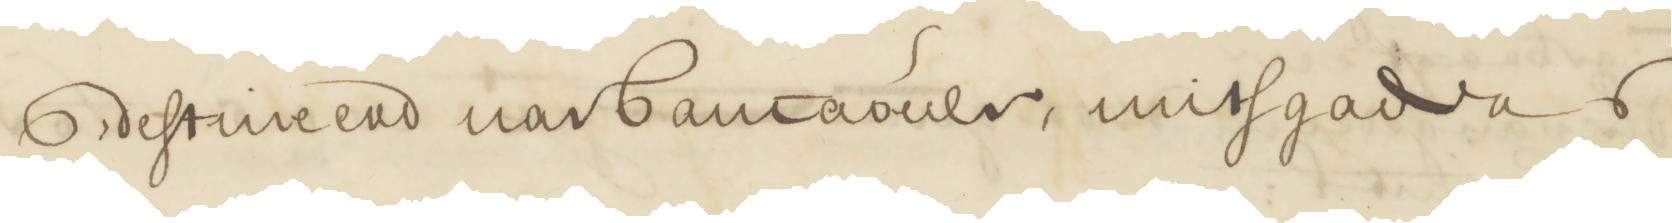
destineerd nae bancaoule, mitsgaders
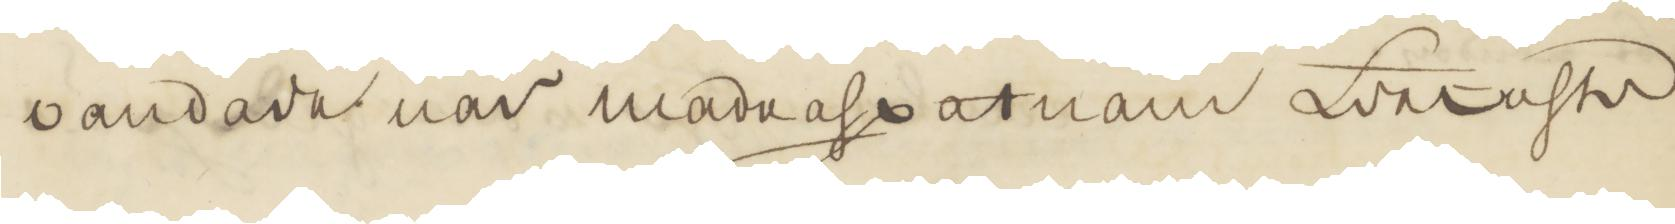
vandaer nae Madraspatnam tercuste
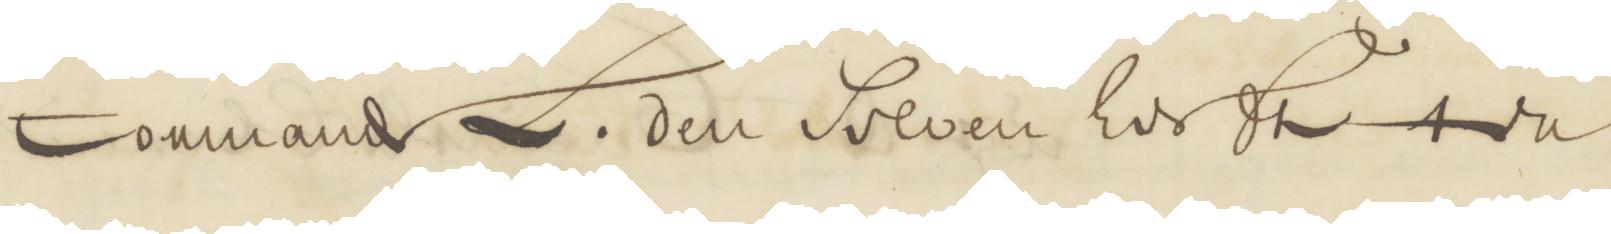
CormandeL. den selven heeft ter
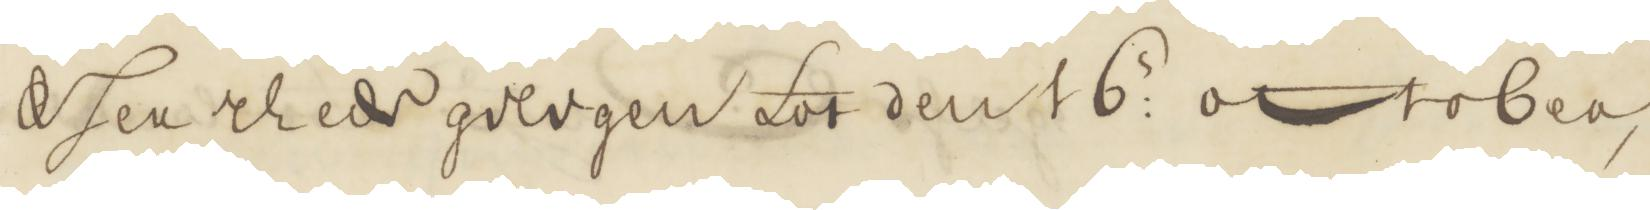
deser rhede gelegen tot den 16:n october,
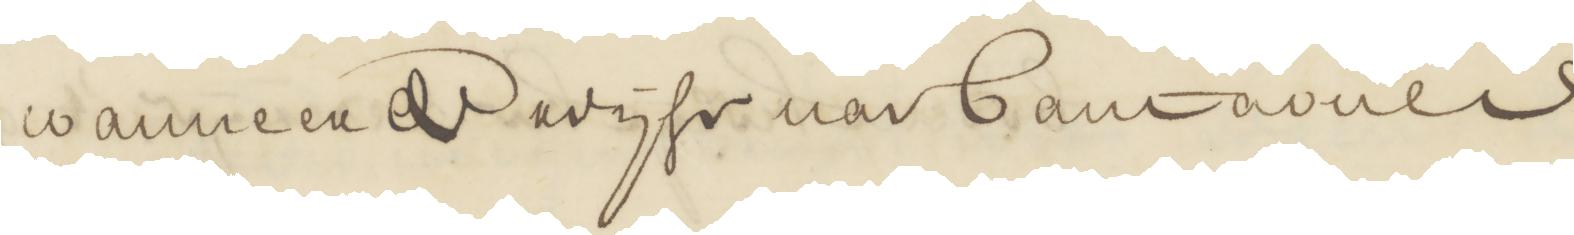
wanneer de reijse nae bancaoule
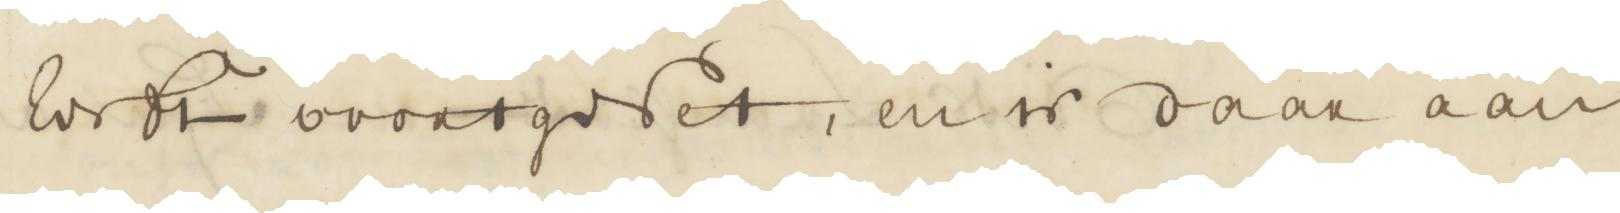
heeft voortgeset, en is daar aan
